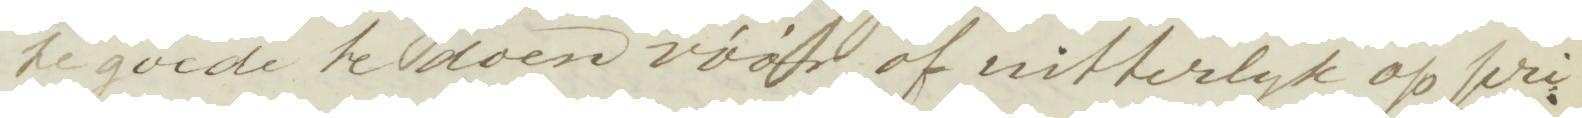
te goede te doen vóór of uitterlyk op pri„
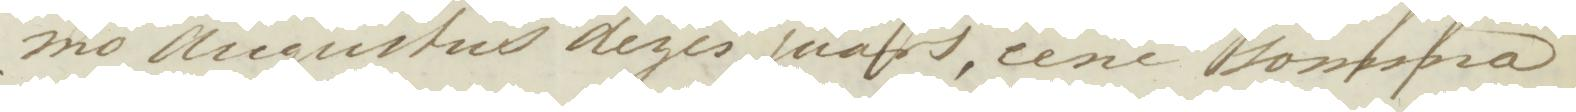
„mo augustus dezes jaars, eene somma
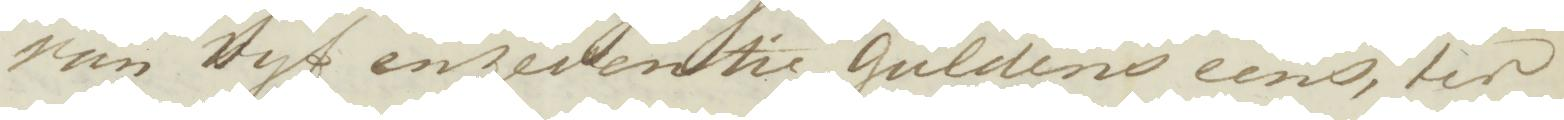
van vyf en zeventig guldens eens, ter
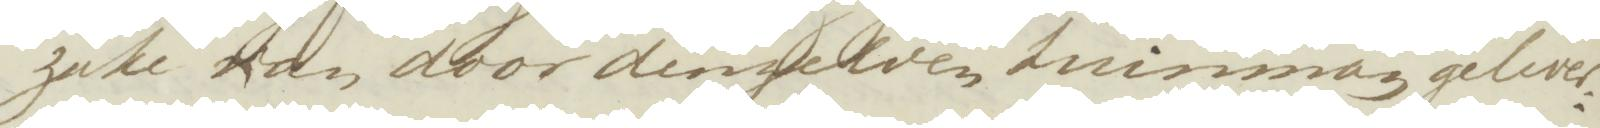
zake van door denzelven tuinman gelever„
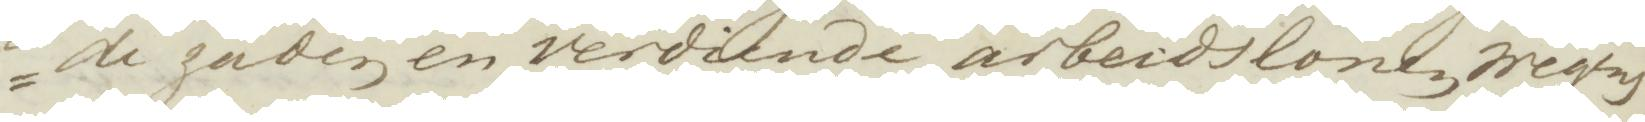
„de zaden en verdiende arbeidslonen wegens
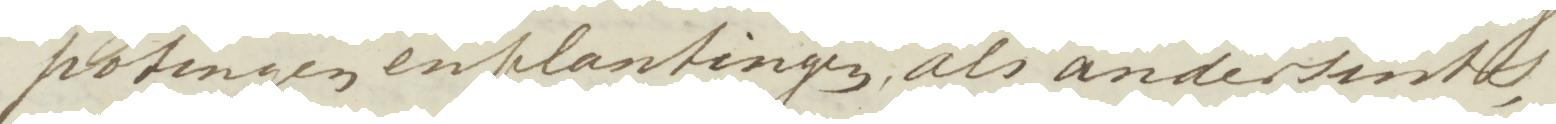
potingen en plantingen, als andersints,
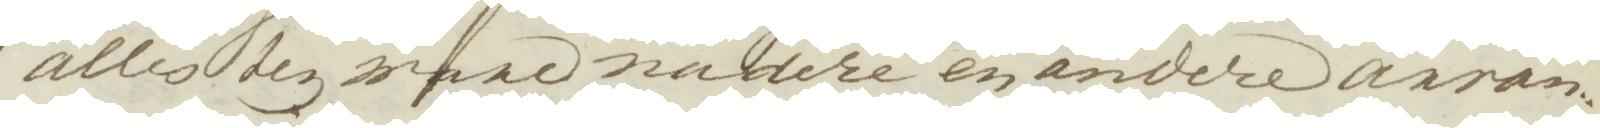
alles ten ware nadere en andere arran„
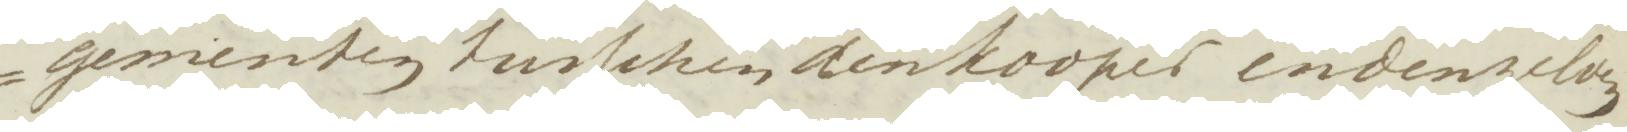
„gementen tusschen den kooper en denzelven
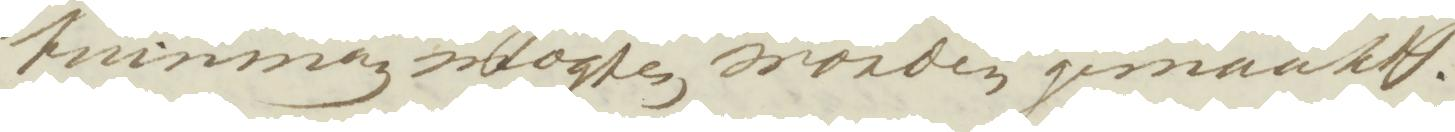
tuinman mogten worden gemaakt.
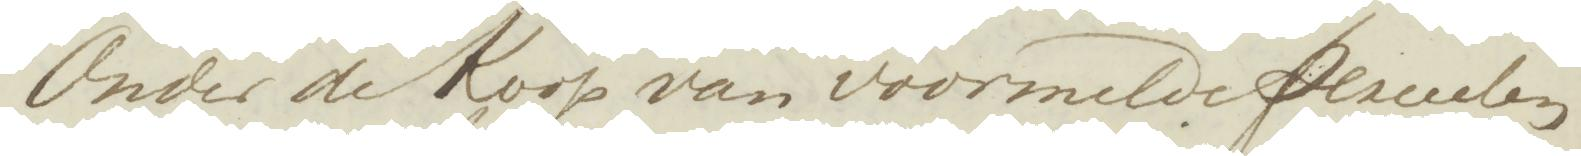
Onder de Koop van voormelde Perceelen
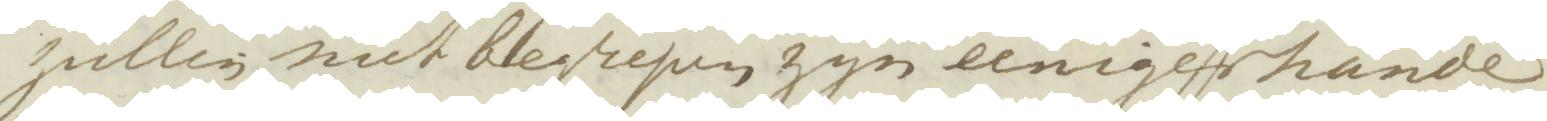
zullen niet begrepen zijn eeniger hande
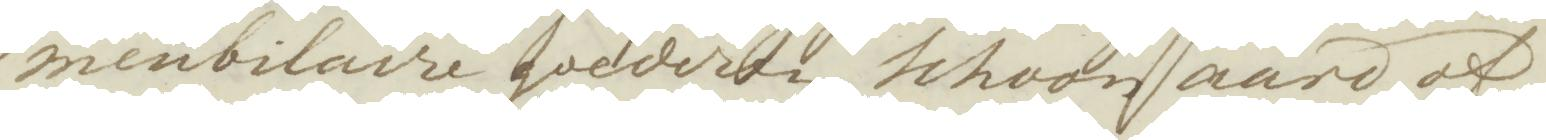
meubilair goederen, schoon aard of
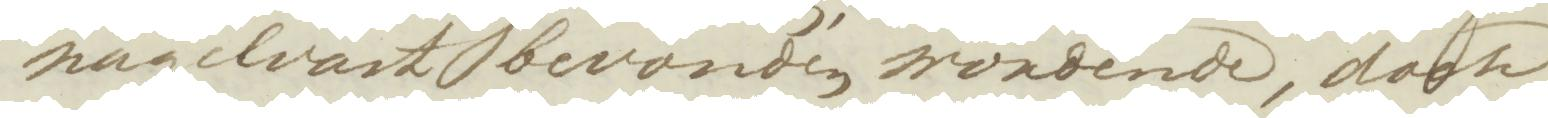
nagelvast bevonden wordende, doch
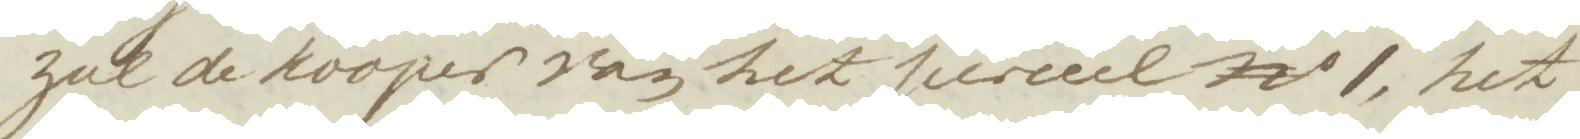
zul de kooper van het perceel N=o 1, het
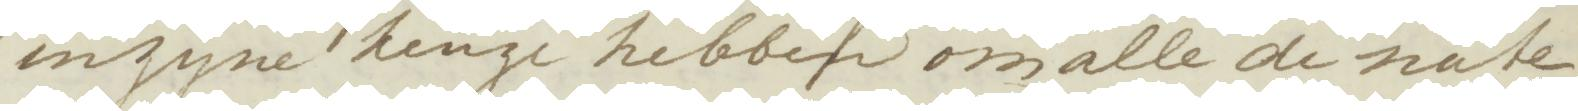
in zyne keuze hebben om alle de nate
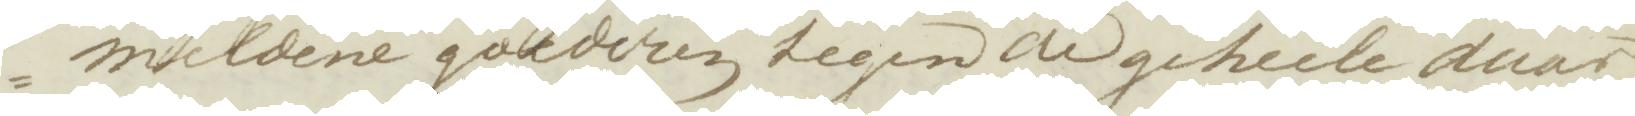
„meldene goederen tegen de geheele daar
